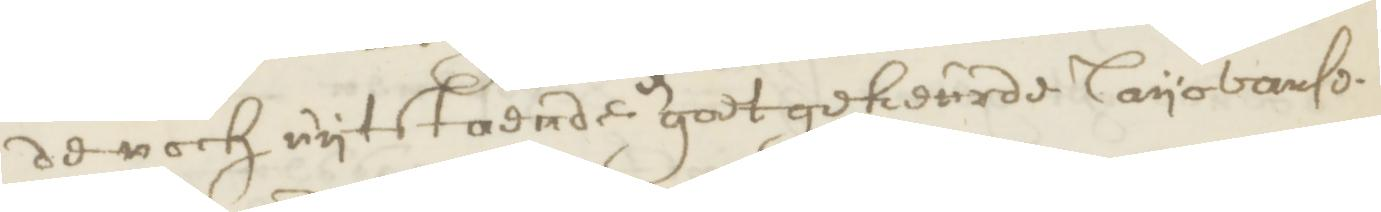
de noch uijtstaende en goet gekeurde Taijovanse.
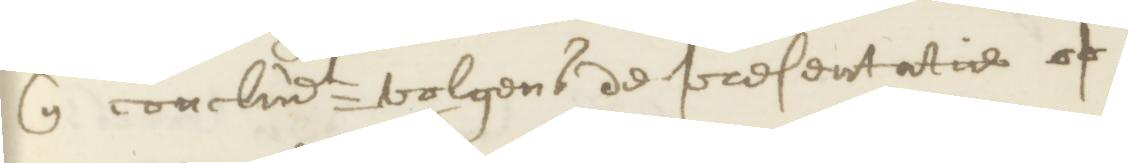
ende conclud=t volgens de presentatie op
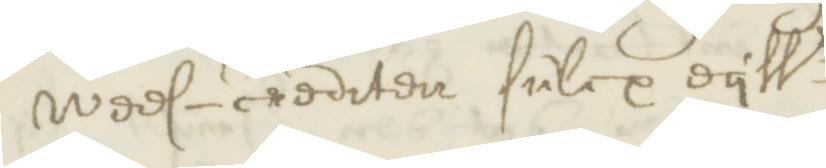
wees-crediten sulcx eijss=rs
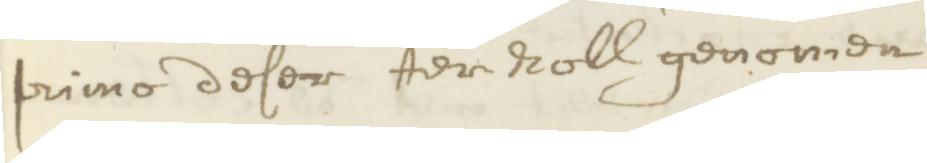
primo deser ter roll genomen
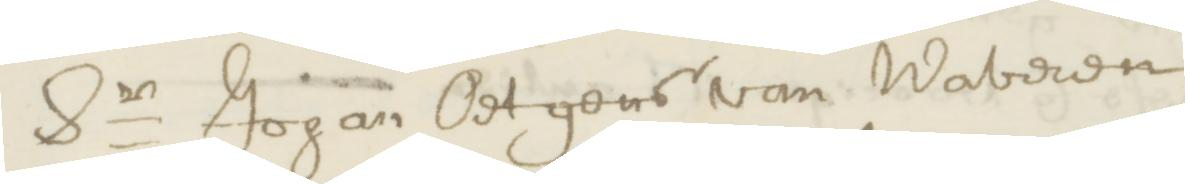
S=r Johan Oetgens van Waveren
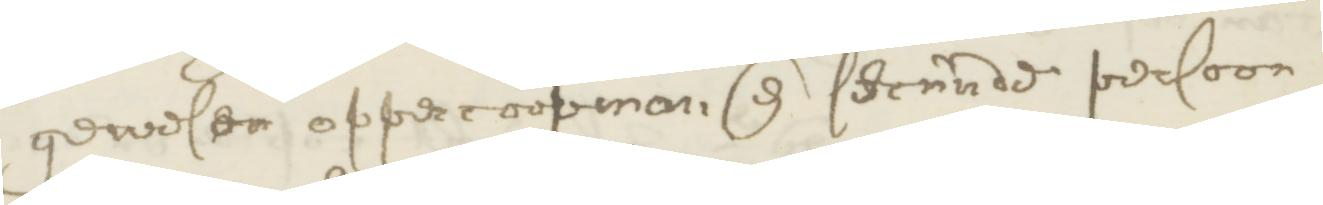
gewesen oppercoopman, ende secunde persoon
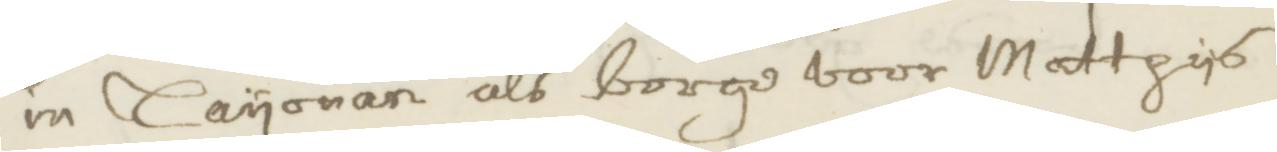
in Taijouan als borge voor Matthijs
